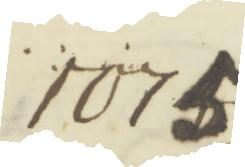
1075
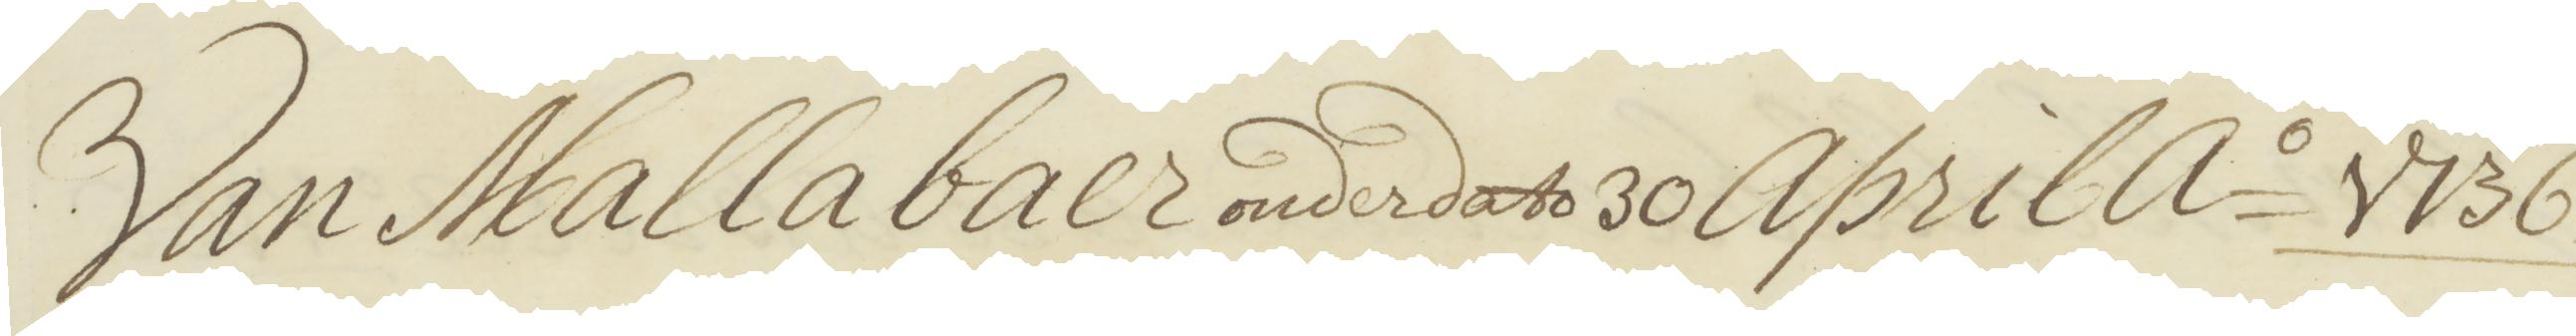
Van Mallabaer onderdato 30 April A=o 1736
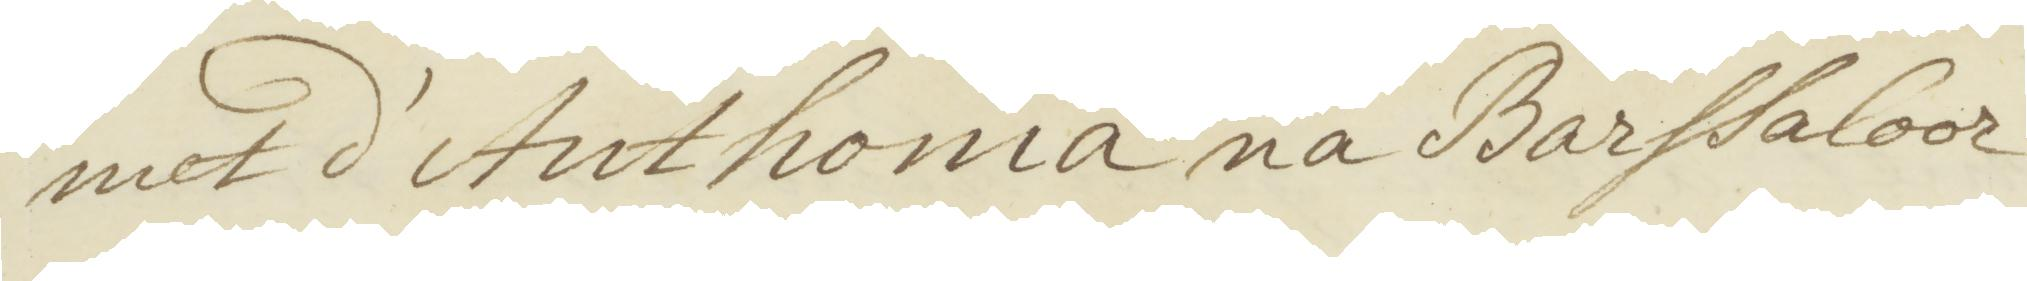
met d’ Anthonia na Barssaloor
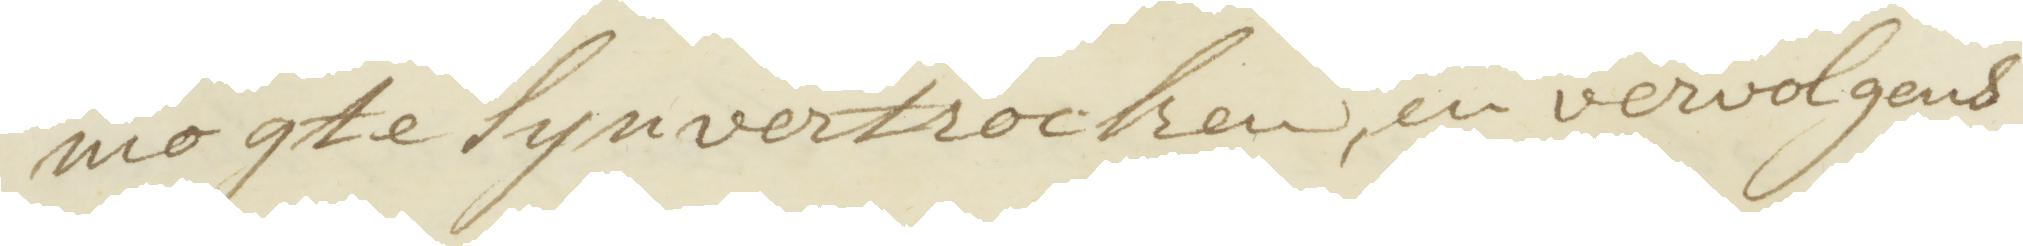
mogte syn vertrocken, en vervolgens
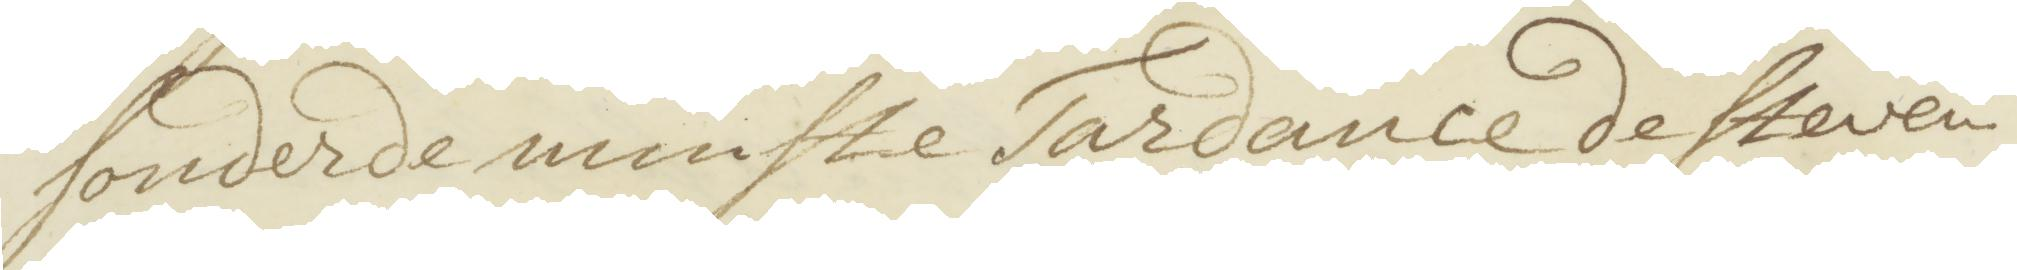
sonder de minste Tardance de steven
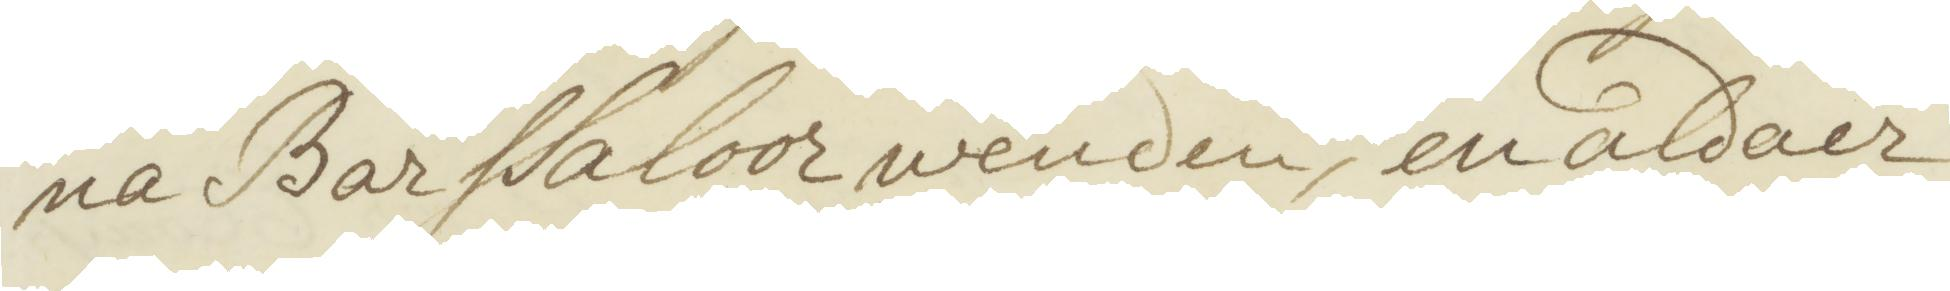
na Barssaloor wenden, en aldaer
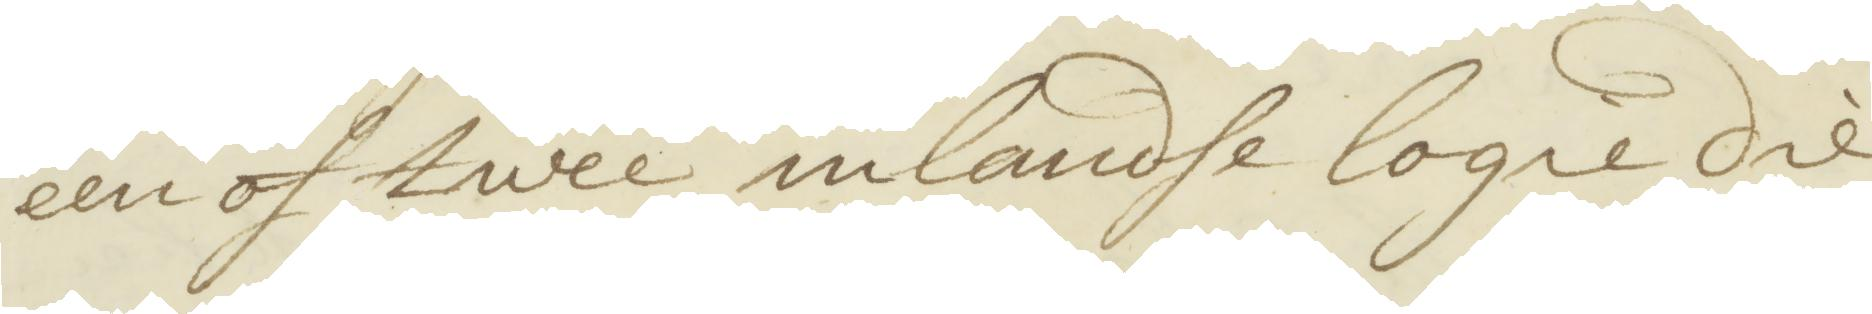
een of twee inlandse logie die
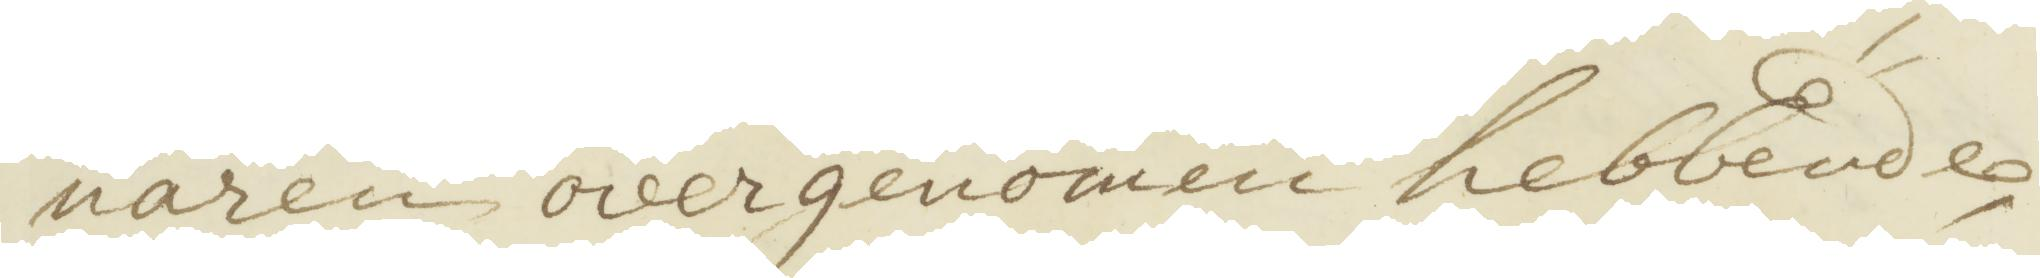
naren overgenomen hebbende,
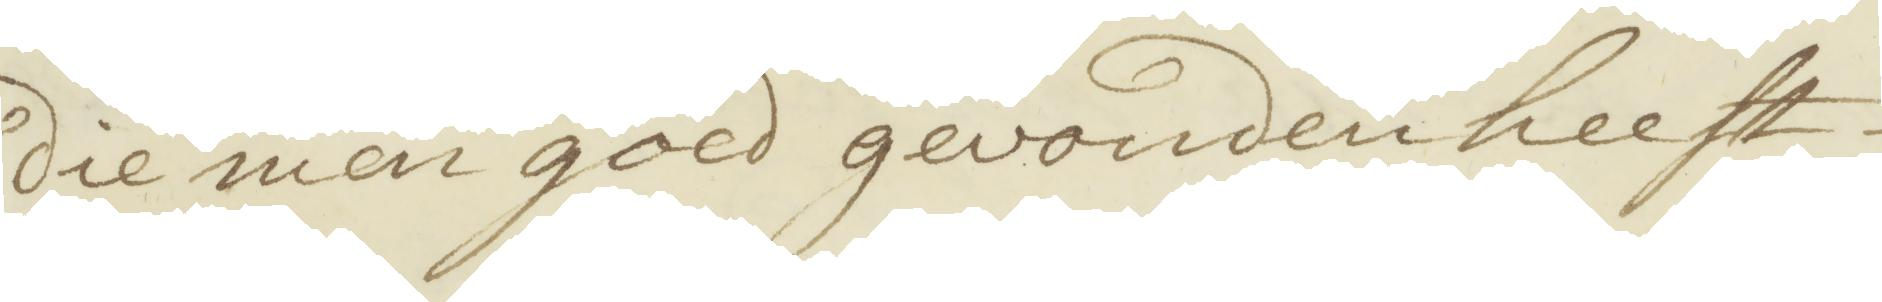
die men goed gevonden heeft
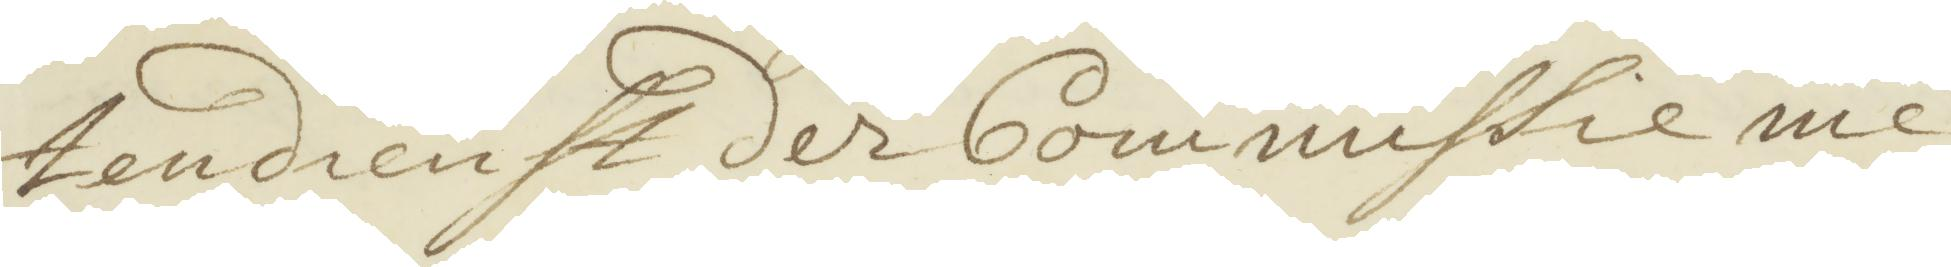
tendienst der Commissie me
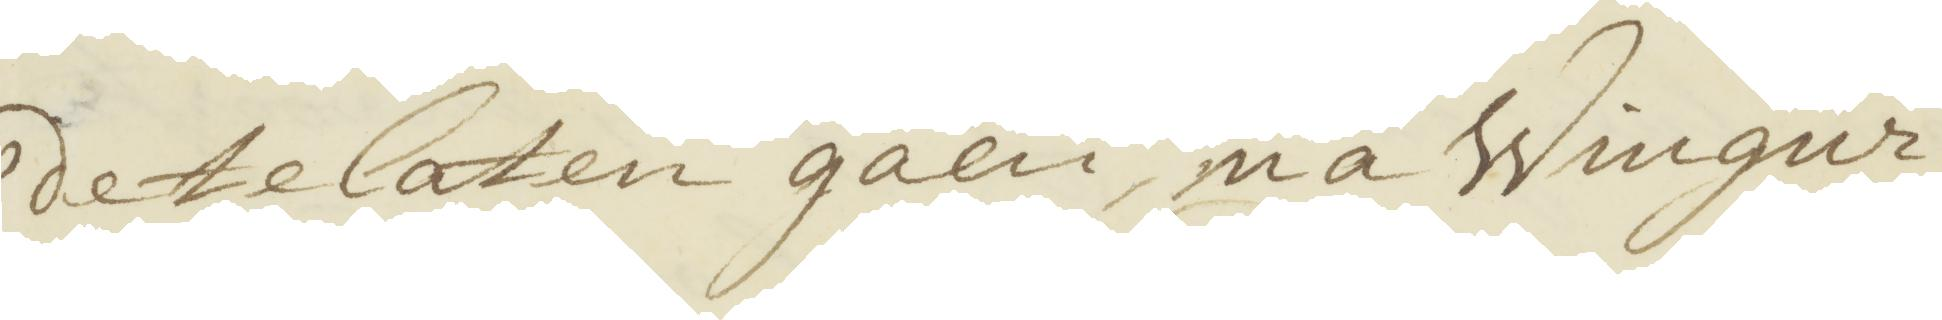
de te laten gaen, na Wingur
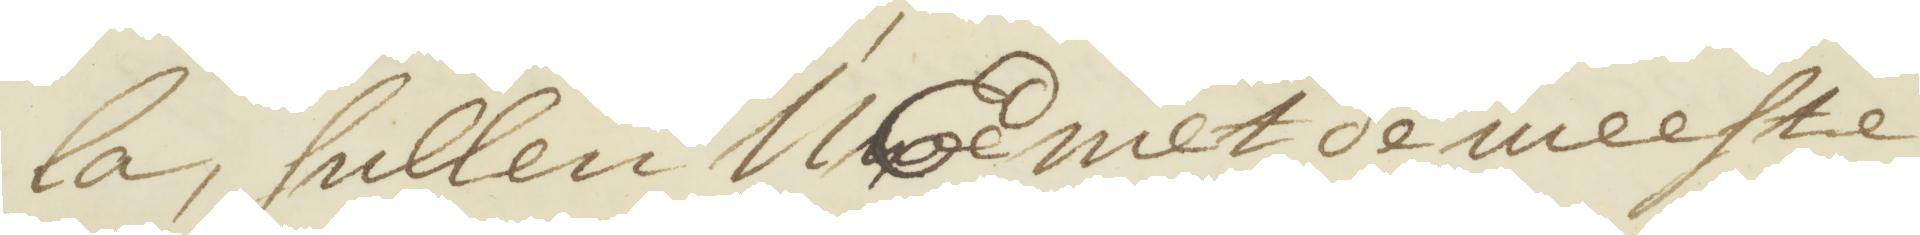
la, sullen UEd met de meeste
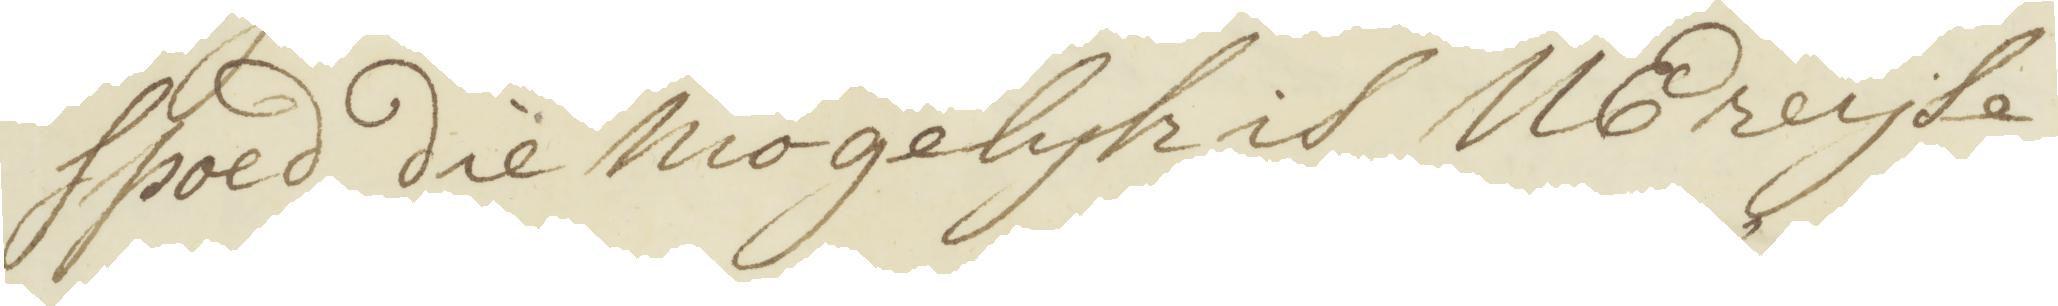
spoed die mogelyk is UE reijse
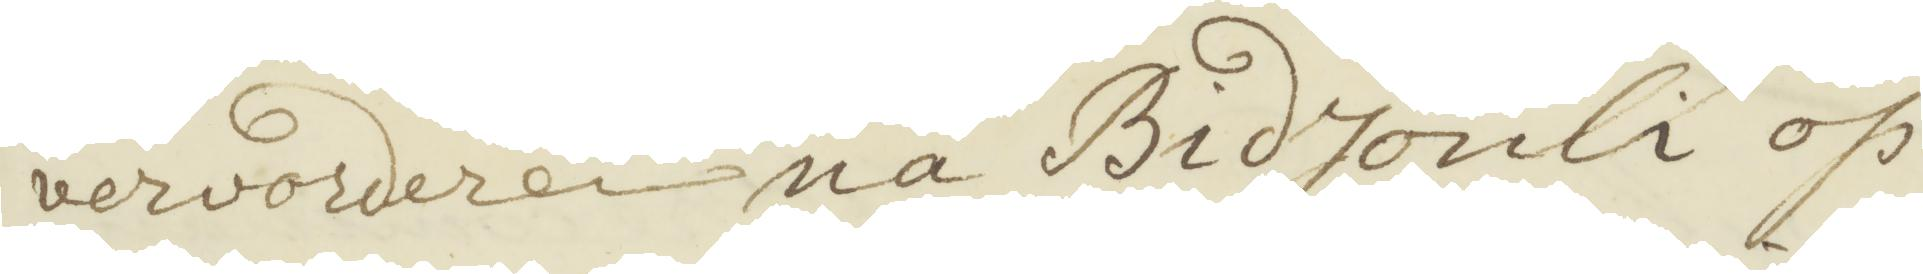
vervorderen na Bidjouli op
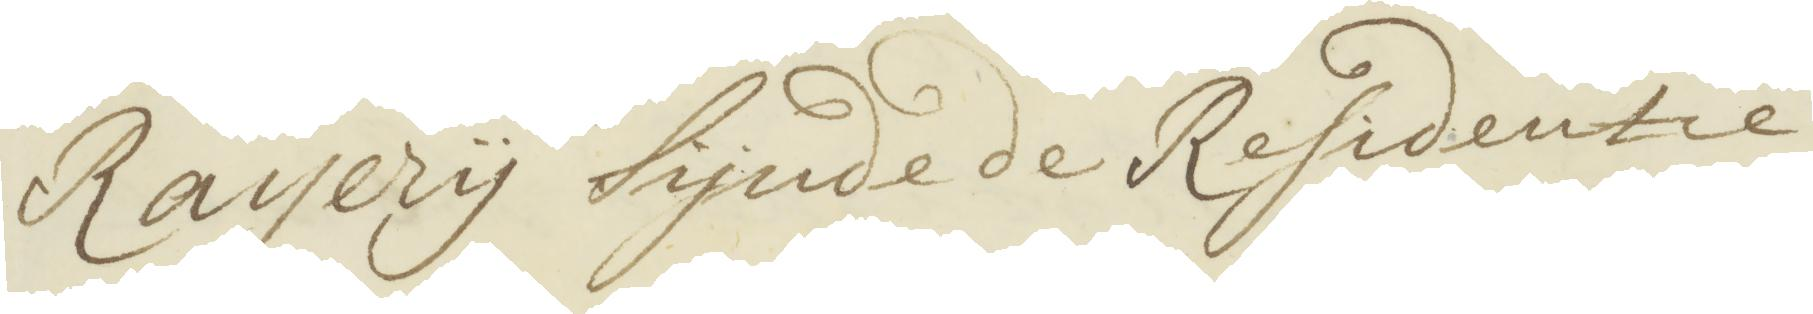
Rayerij sijnde de Residentie
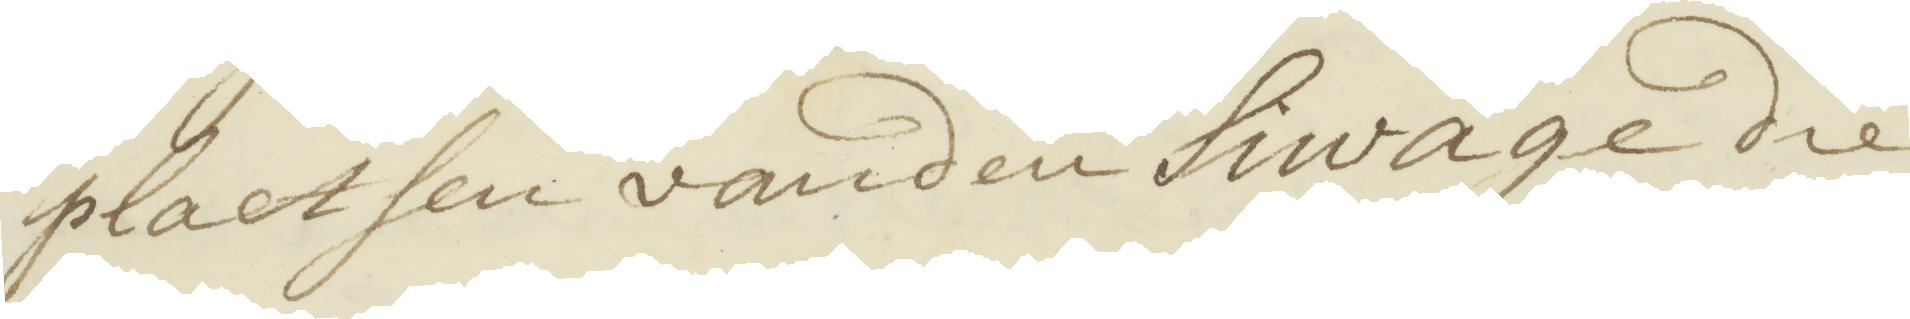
plaetsen van den siwage die
